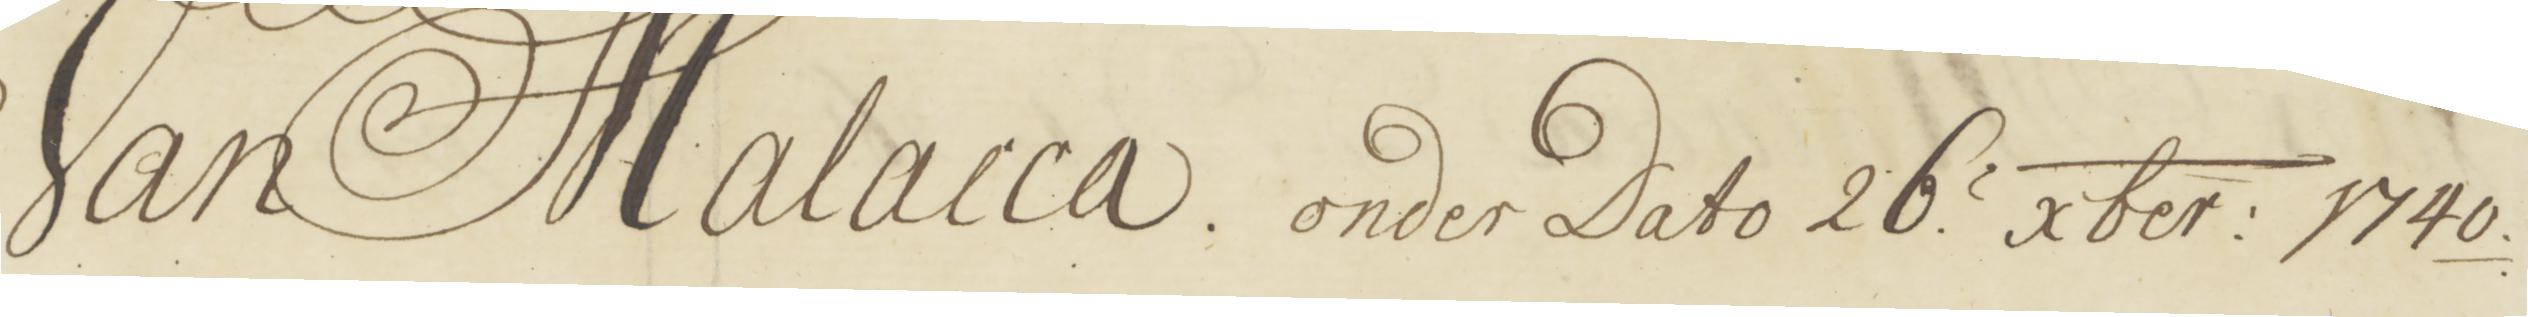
Van Malacca. onder Dato 26.' xber: 1740.
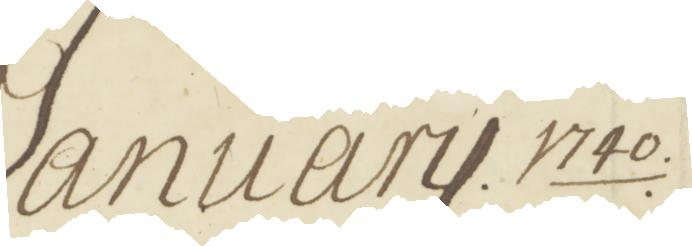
Januarij 1740.
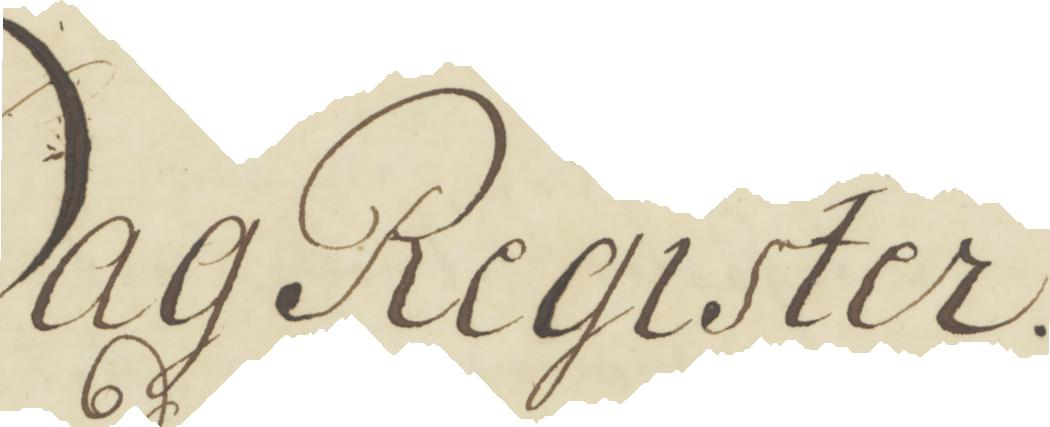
Dag Register.
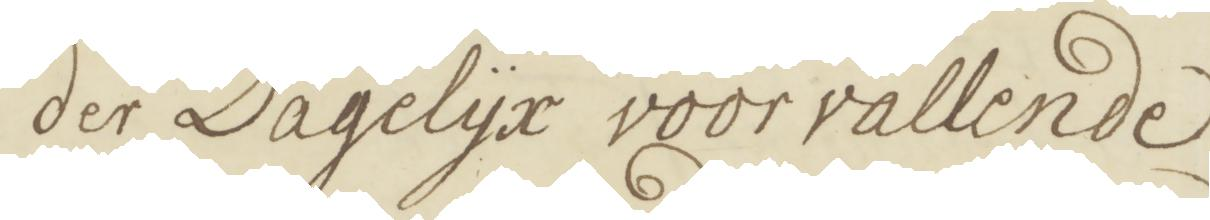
der Dagelijx voor vallende
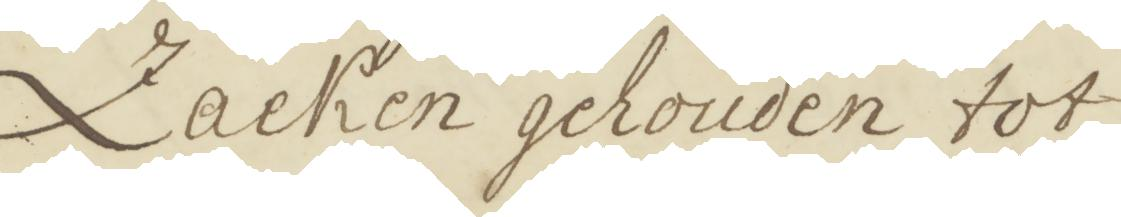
Zaeken gehouden tot
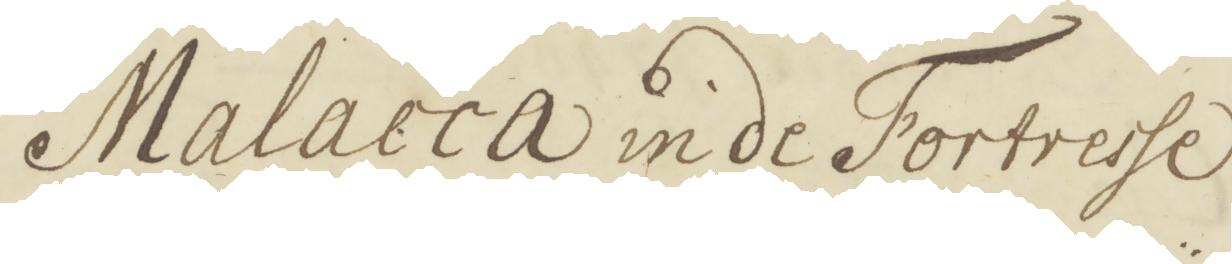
Malacca in de Fortresse
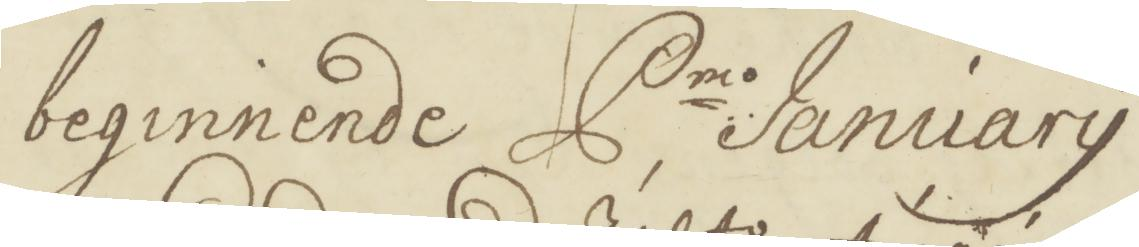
beginnende P=mo, Januarij
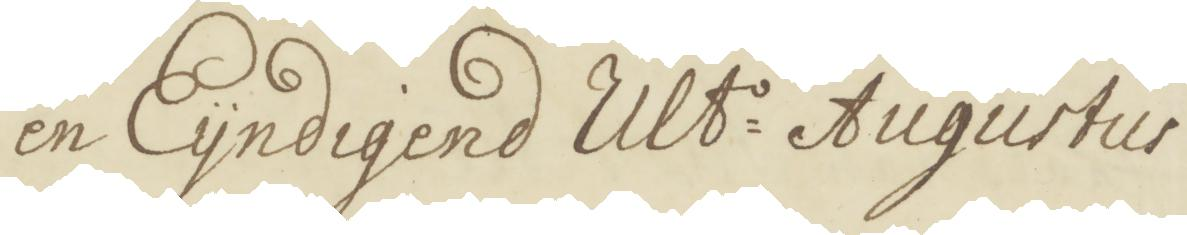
en Eijndigend ult=o Augustus
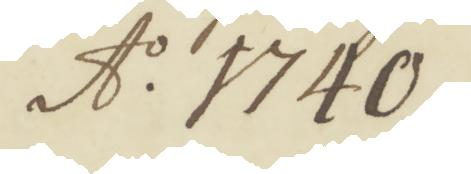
A.o 1740.
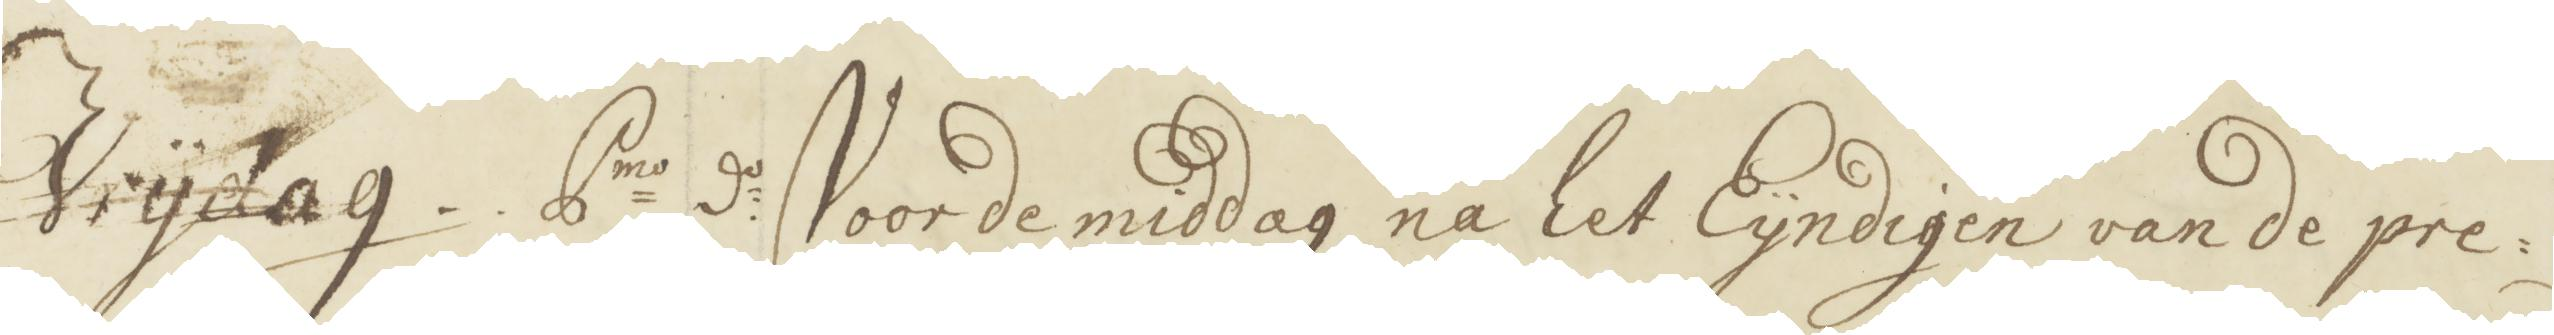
Vrijdag - P=mo d=o. Voor de middag na het Eijndigen van de pre=
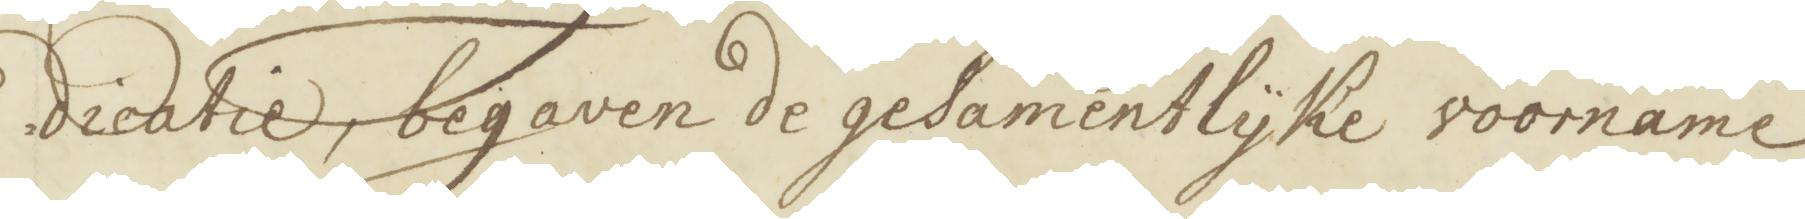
=dicatie, begaven de gesamentlijke voorname
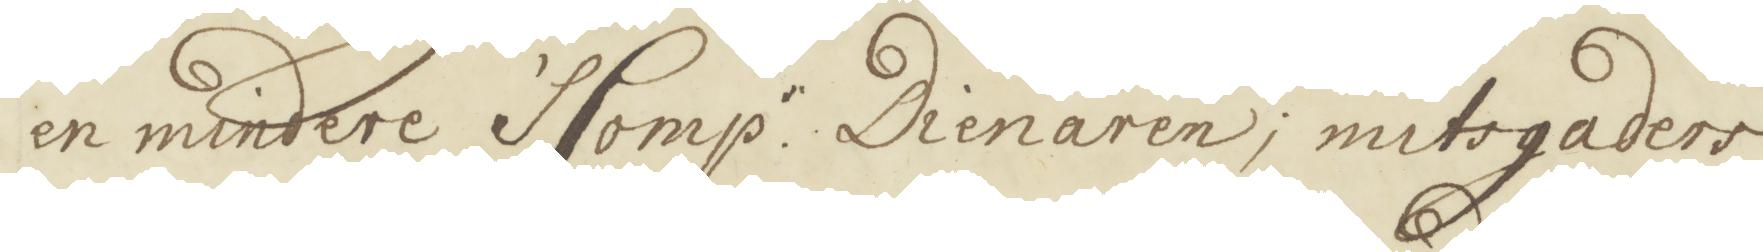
en mindere 's Comp.s Dienaren; mitsgaders
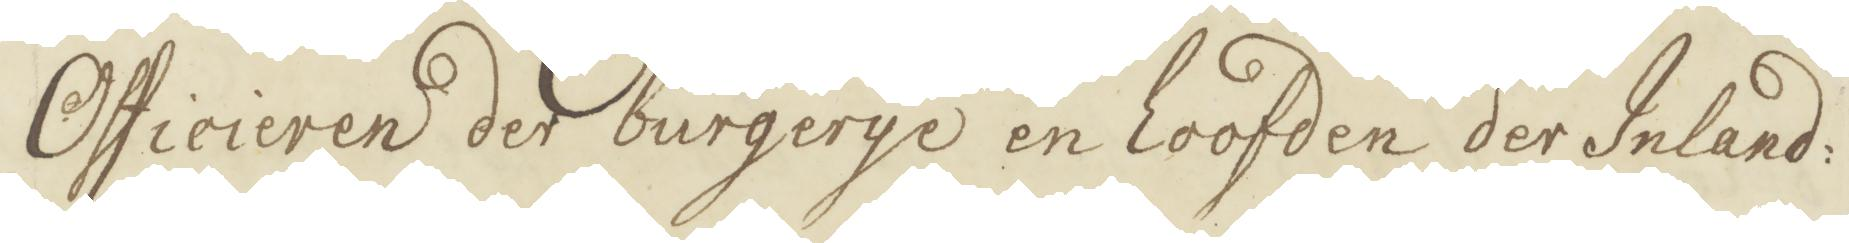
Officieren der burgerije en hoofden der Inland:
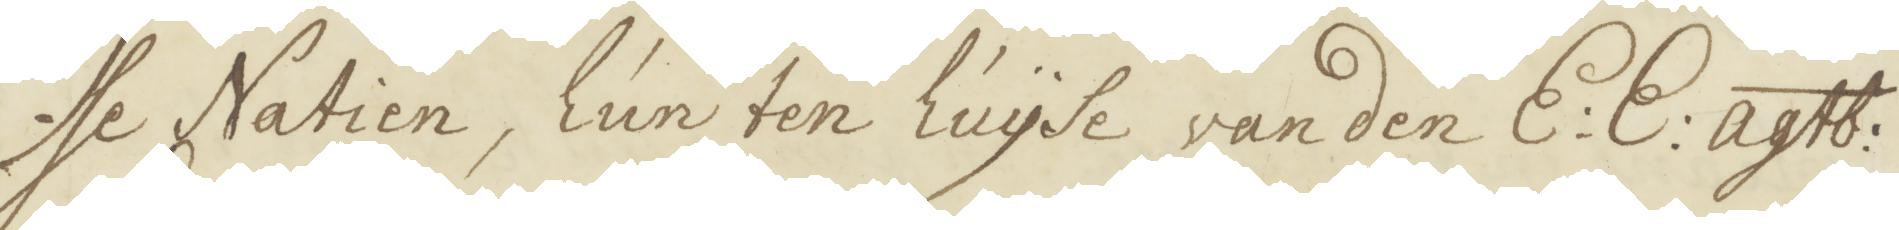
-se Natien, hun ten huijse van den E: E: agtb:
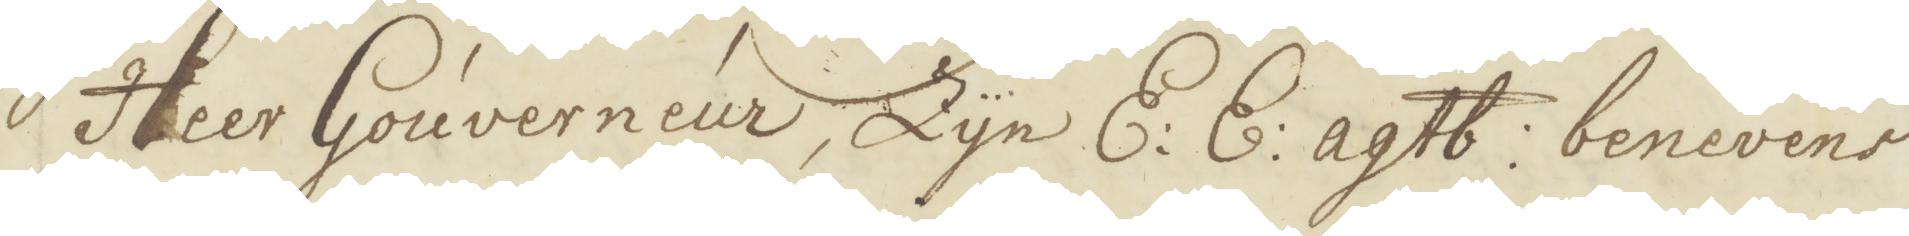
Heer Gouverneur, zijn E: E: agtb: benevens
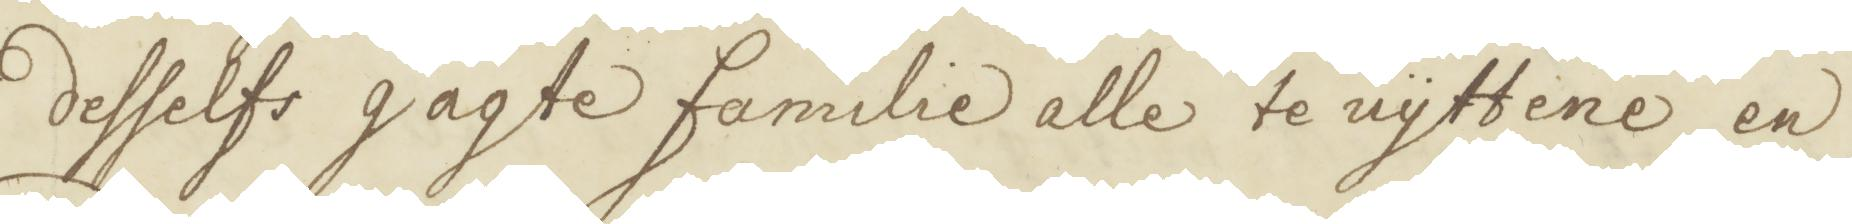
desselfs g'agte familie alle te uijttene en
